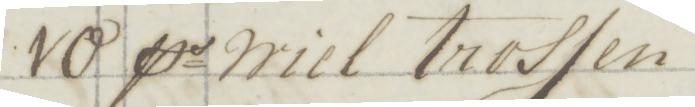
10 p=s wiel trossen
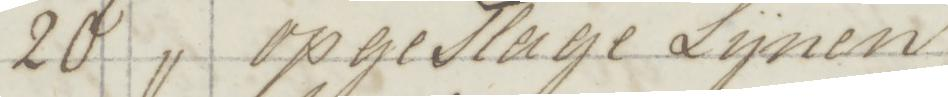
20 „ opgeslage lijnen
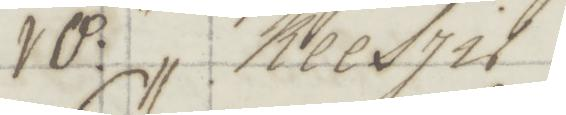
10: keesjis
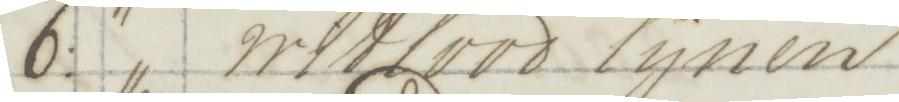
6: „ witlood lijnen
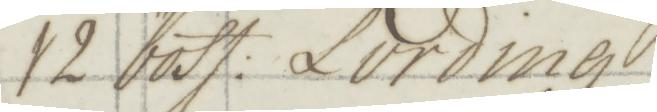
12 boss: Lording
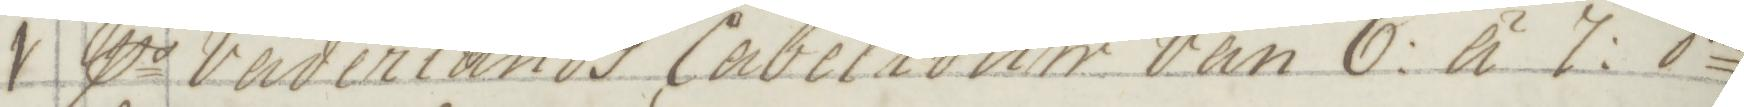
1 p=s Vaderlands Cabeltouw van 6: à 7: d=m
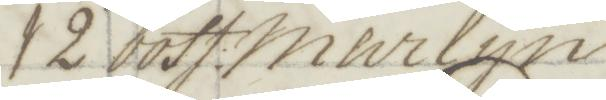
12 boss: Marlijn
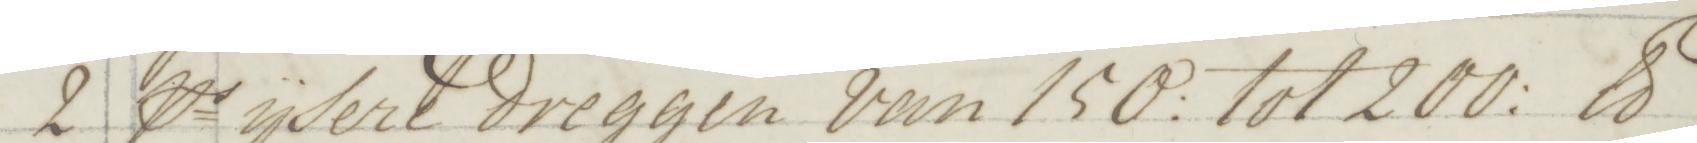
2 p=s ijsere dreggen van 150: tot 200: ld
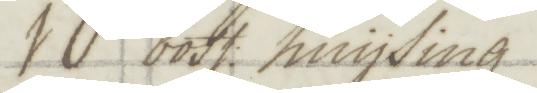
10 boss huijsing
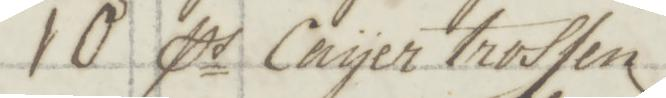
10 p=s Caijer trossen
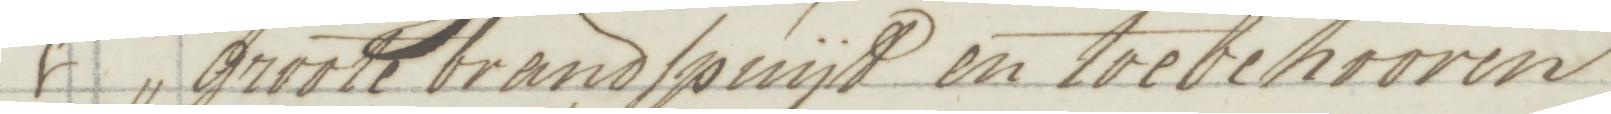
1 „ groote brandspuijt en toebehooren
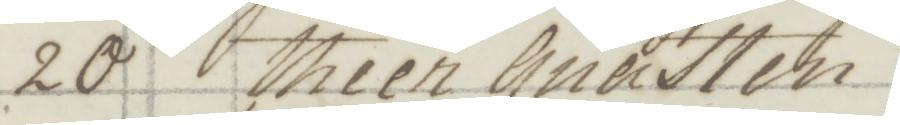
20: theer quasten
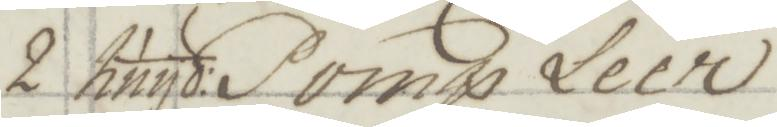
2 huijd: Somp Leer
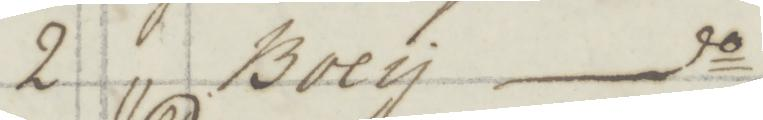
2 „ Boeij _=o
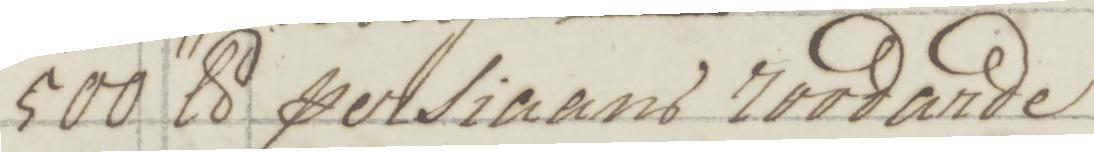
500 ld persiaans roodarde
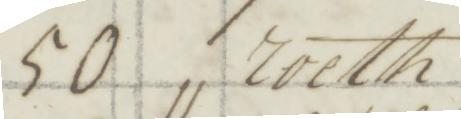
50„ roeth
